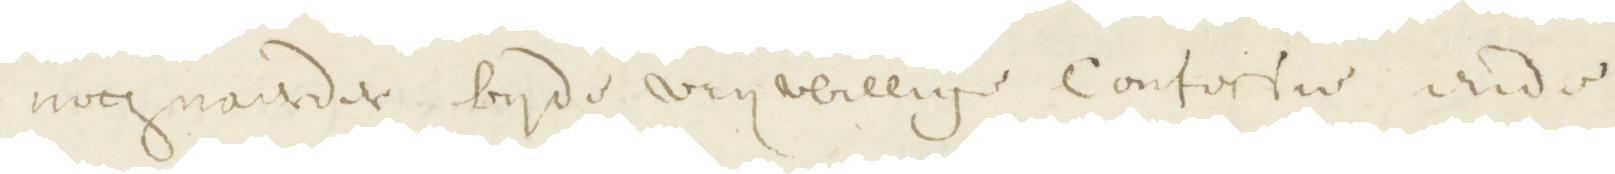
nog naerder byde vrywillige Confessie ende
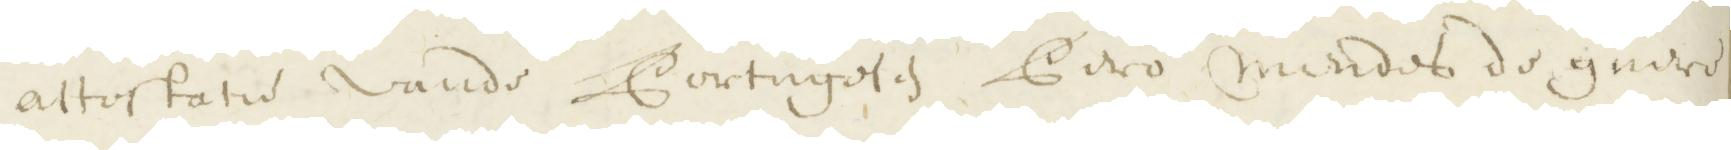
attestatie vande Portugesen Pero mendes de guere
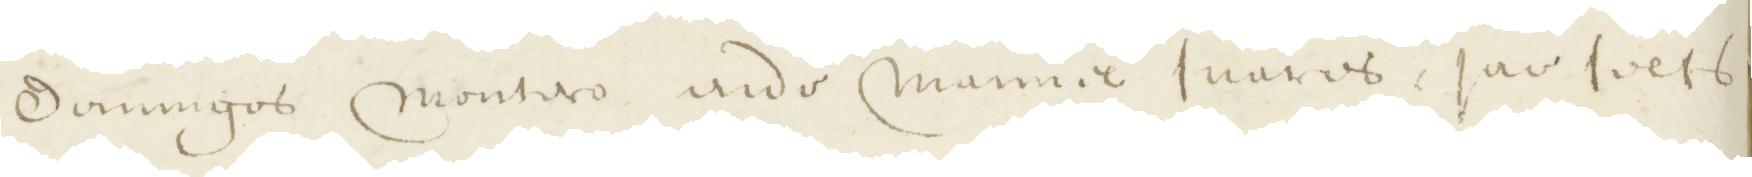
Domingos montero ende manuel snares, jae selfs
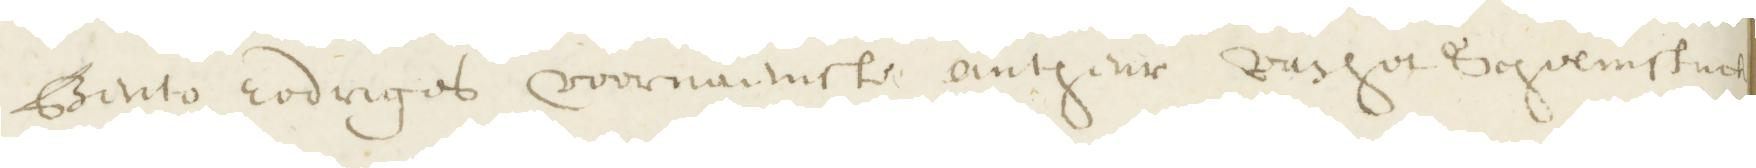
Bento rodriges voornaemste autheur van het schelmstuck
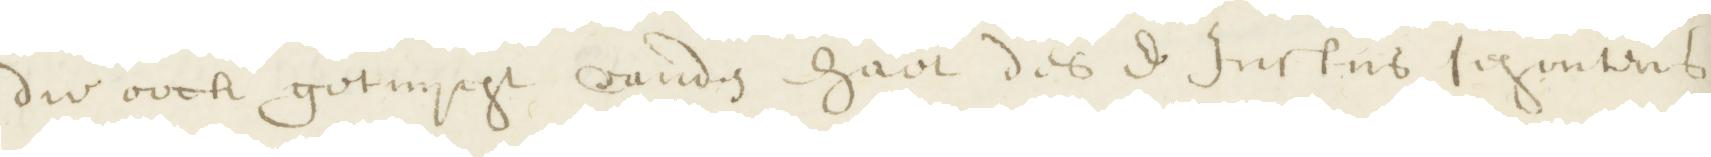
die oock getuycht vanden haet des E Iustus schoutens
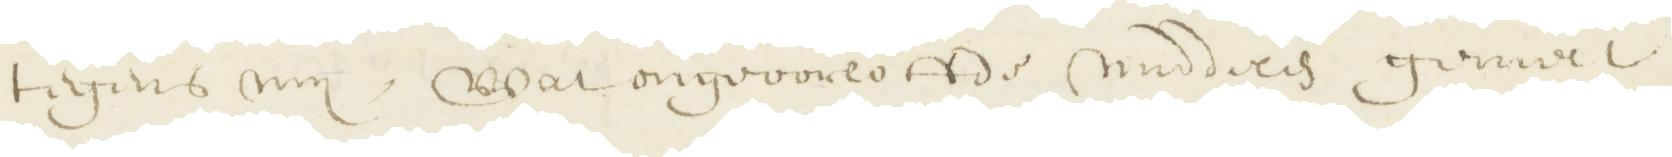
tegens my, wat ongeoorloffde middelen gemelt
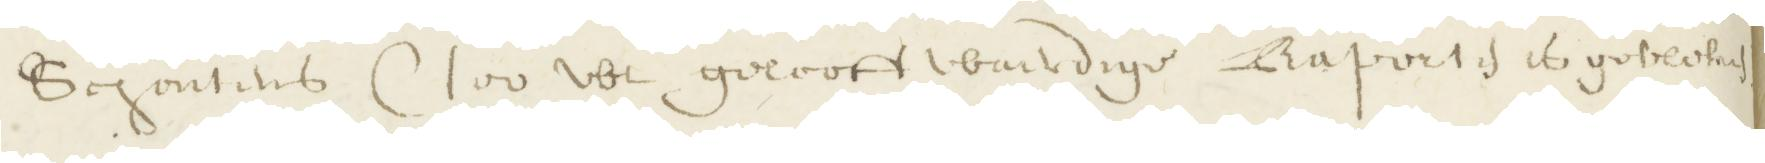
Schoutens (soo wt gelooffwaerdige Raporten is gebleken
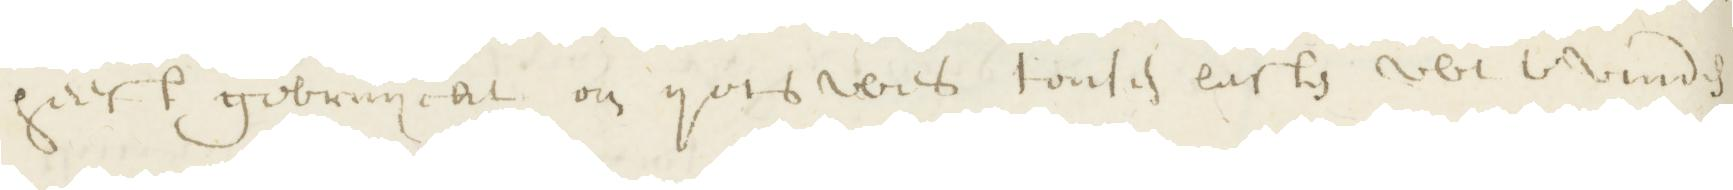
heeft gebruyckt om yets wes t'onsen lasten wt te vinden
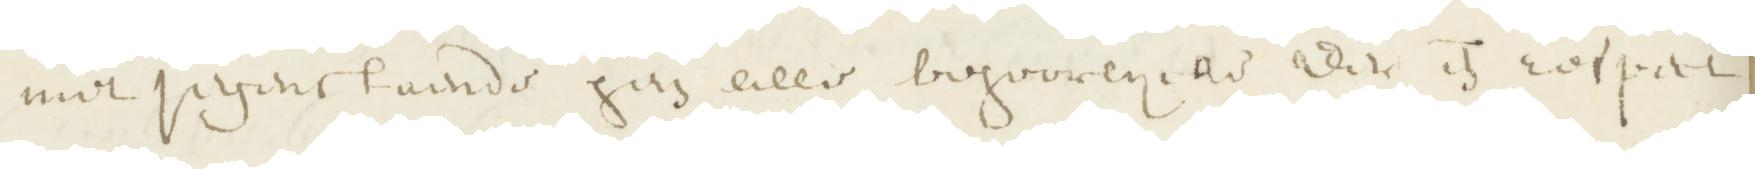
niet jegenstaende hem alle behoorlycke Eer en respect
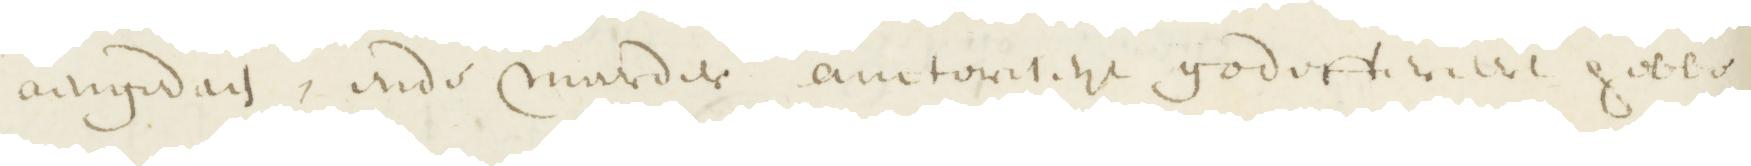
aengedaen, ende meerder autoriteyt gedestineert hebbe
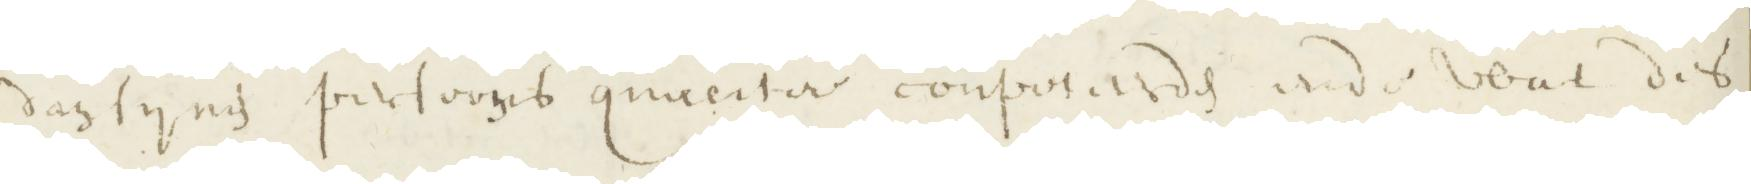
dan synen persoones qualiteit conpeteerden ende wat des
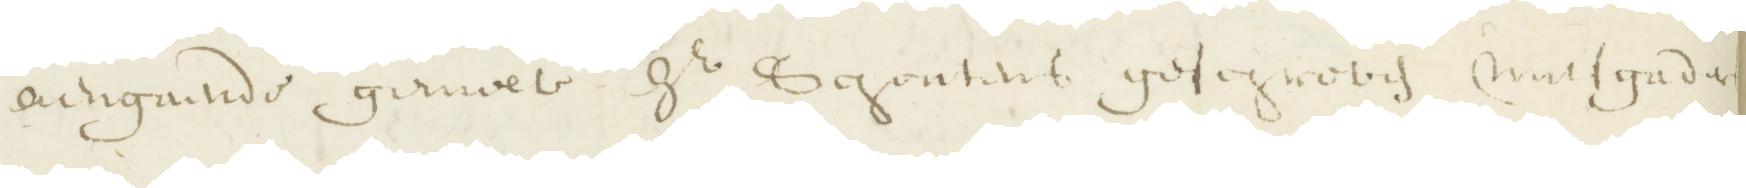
aengaende gemelte hr Schoutens geschreven mitsgade
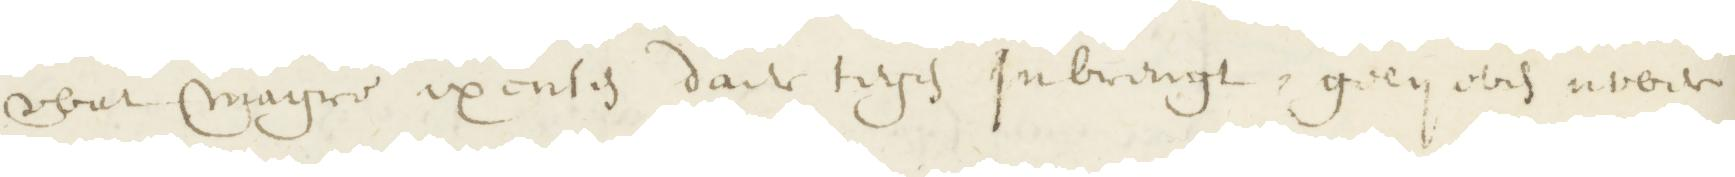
wat magre excusen daer tegen Jnbrengt, gelyeven uwer
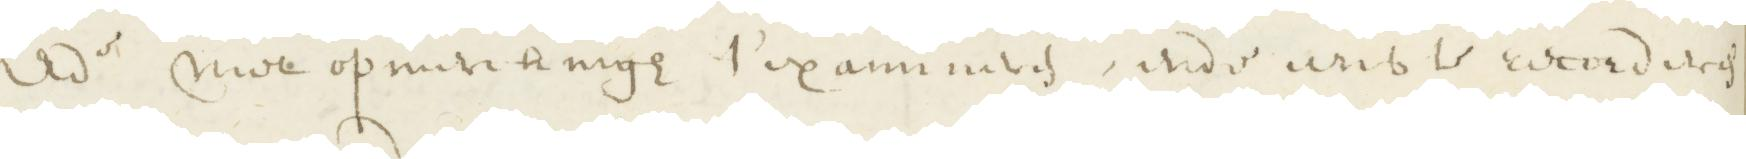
Ede met opmerckingen t' examineren, ende eens te recorderen
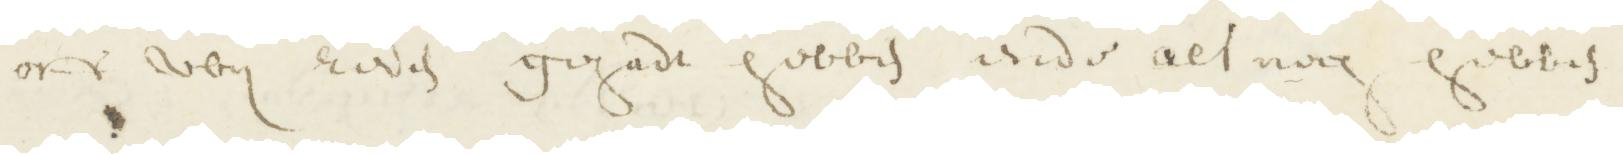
off wy reden gehadt hebben ende als nog hebben
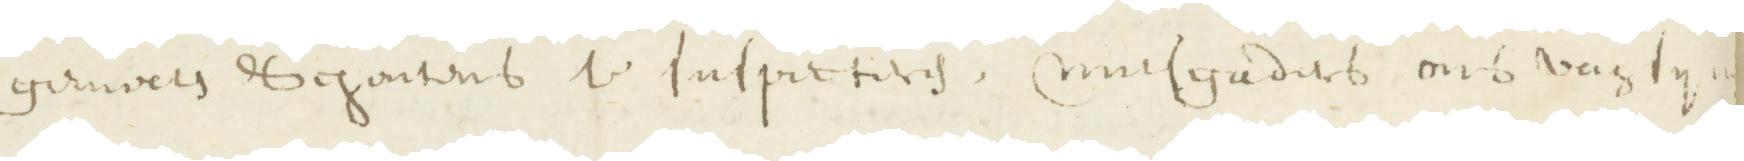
gemelten schentens te suspecteren, mitsgaders ons van syn
